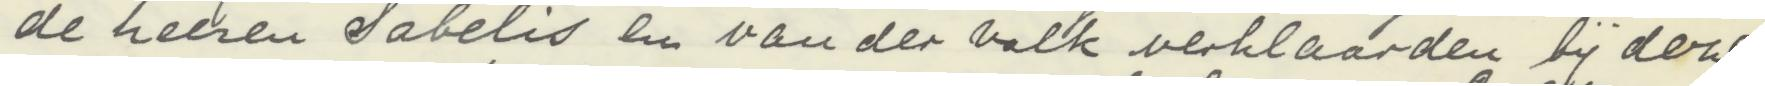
de heeren Sabelis en van der valk verklaarden bij deze
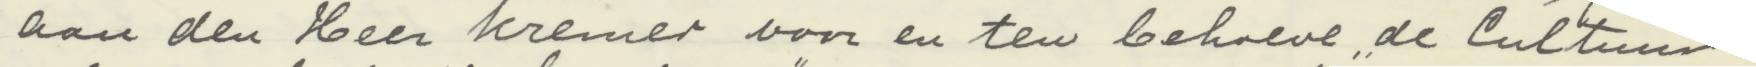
aan den Heer kremer voor en ten behoeve „ de Cultuur -
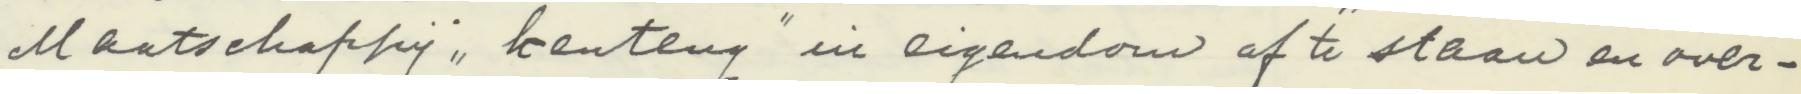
Maatschappij „ kenteng " en eigendom af te staan en over-
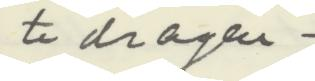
te dragen
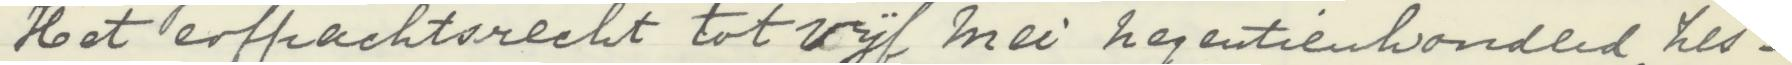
Het erfpachtsrecht tot vijf mei negentienhonderd zes-
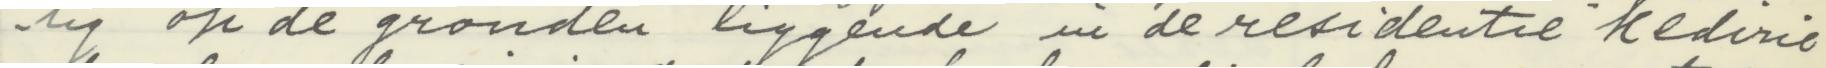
-tig op de gronden liggende in de residentie kedirie
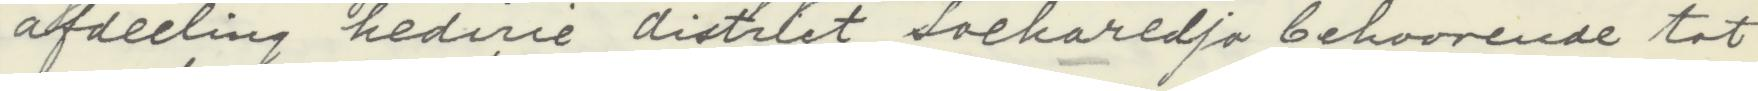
afdeeling kedirie district Soekaredja behoorende tot
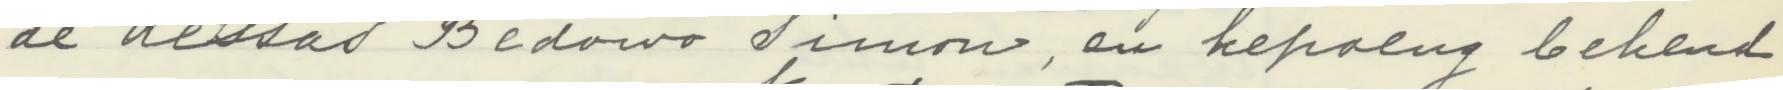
de dessas Bedowo Simon, en kepoeng bekend
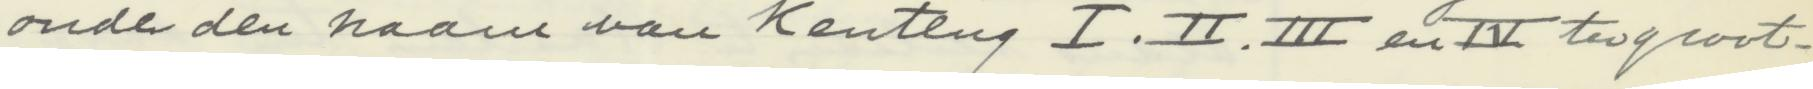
onder den naam van Kenting I. II. III en IV ter groot-
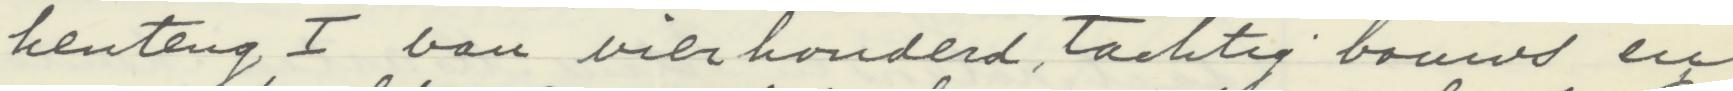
kenteng I van vierhonderd, tachtig bouws en
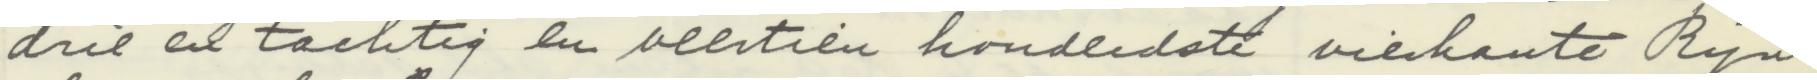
drie en tachtig en veertien honderdste vierkante Rijn-
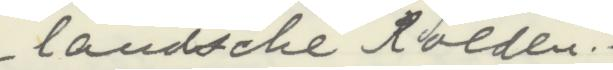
-landsche Roeden.
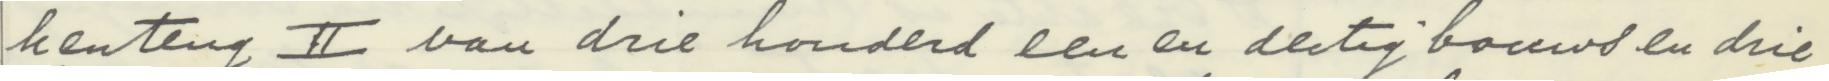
kenteng II van drie honderd een en dertig bouws en drie
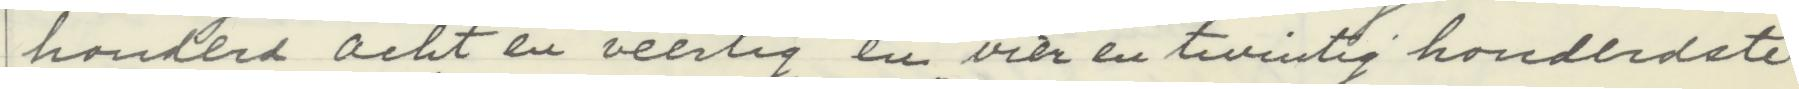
honderd acht en veertig en vier en twintig honderdste
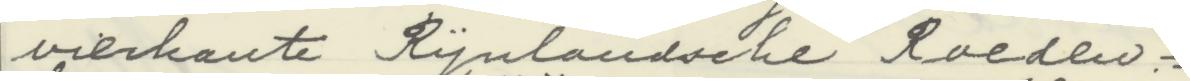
vierkante Rijnlandsche Roeden.
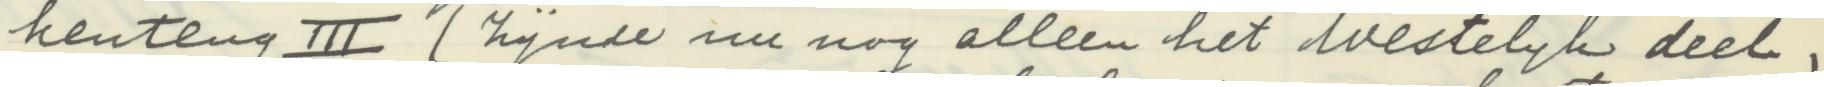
kenteng III ( zijnde nu nog alleen het westelyk deel
